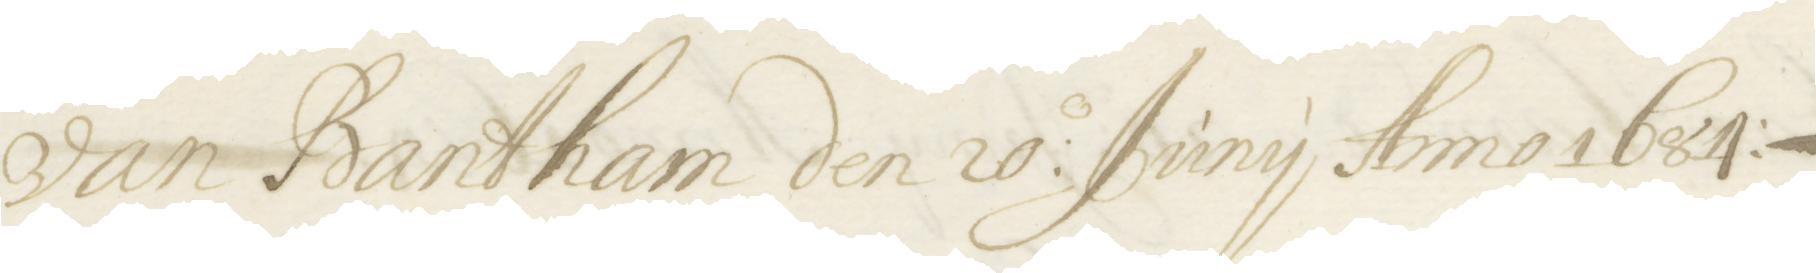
Van Bantham den 20:e Junij Anno 1684: —
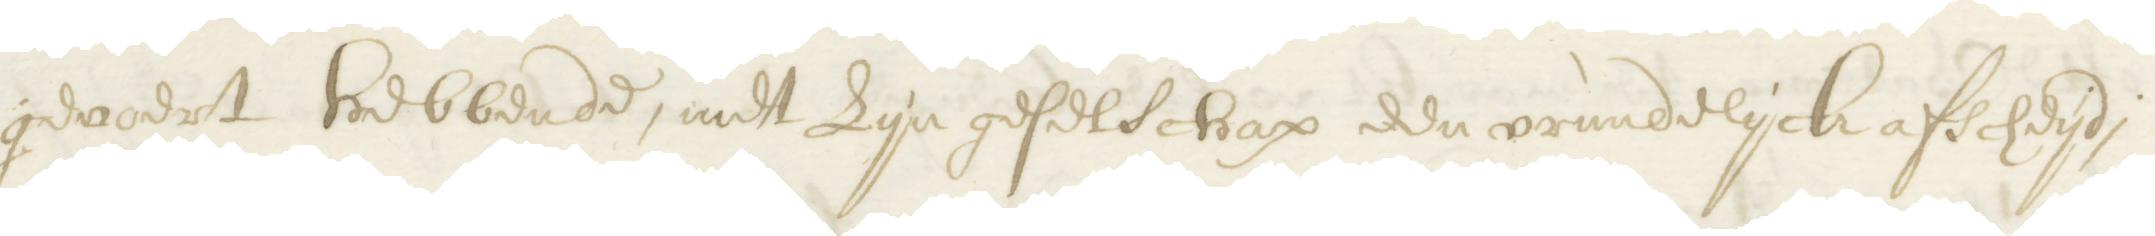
gevoert hebbende, met zijn geselschap een vrundelijck afscheijd;
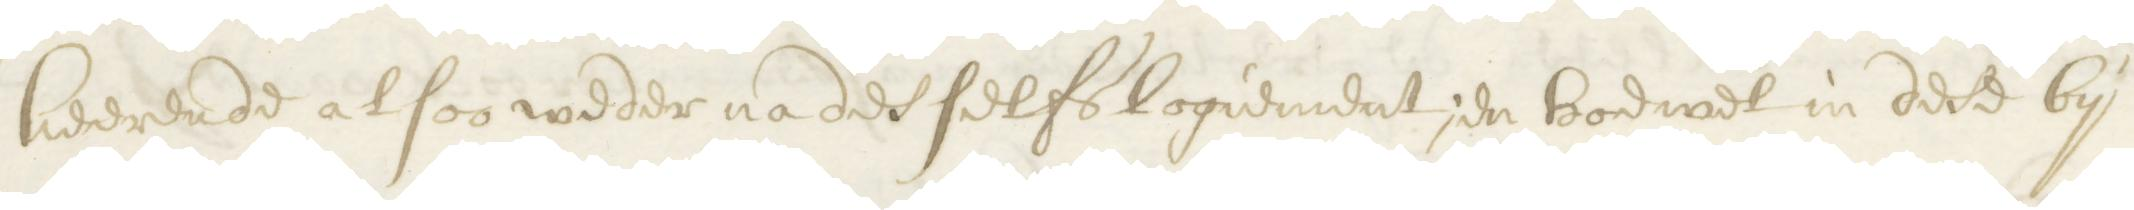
keerende alsoo weder na des selfs logiement; en hoewel in dese bij
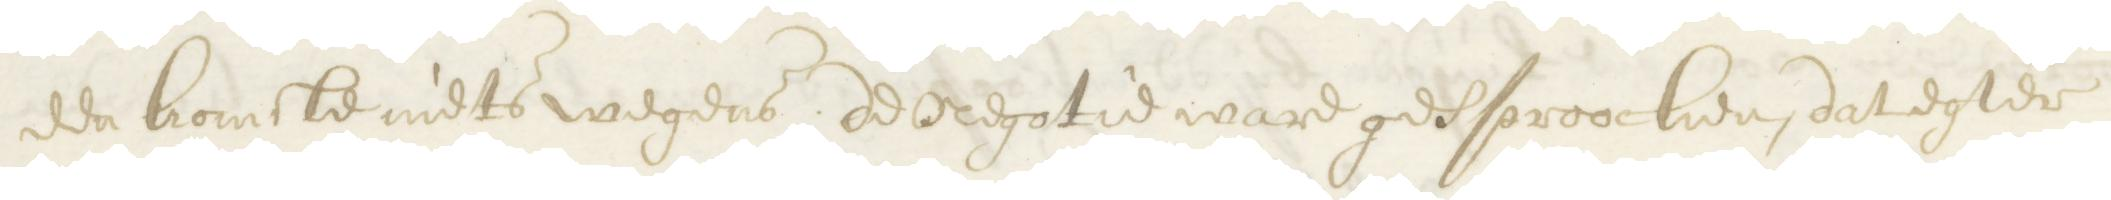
een komste niets wegens de Negotie ware gesproocken, dat egter
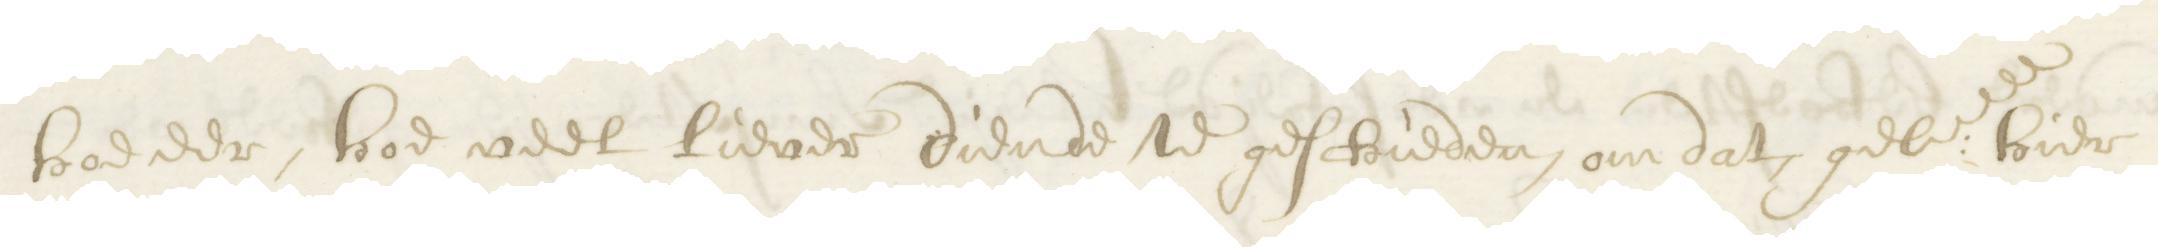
hoe eer, hoe veel liever diende te geschieden, om dat, geb: hier
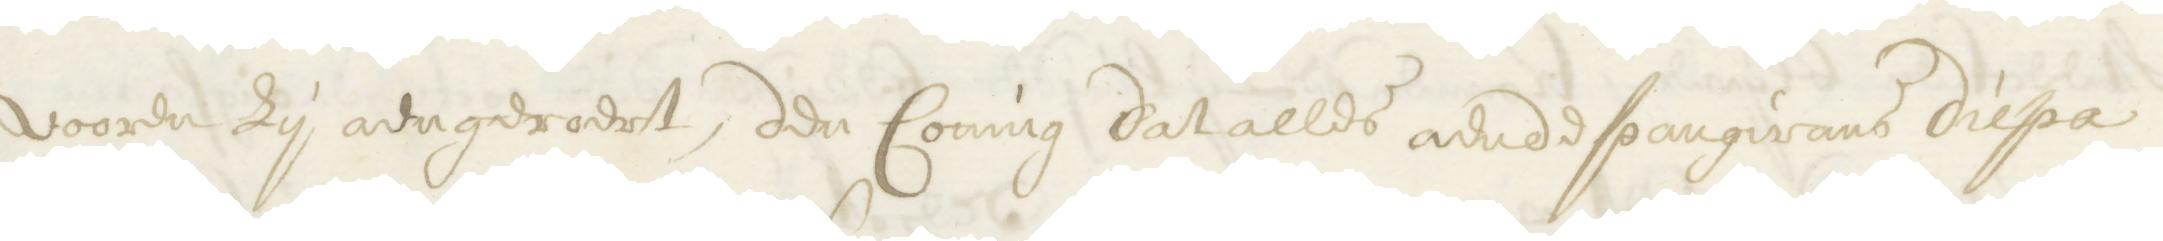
vooren zij aengeroert, den Coning dat alles aen de pangirans diepa
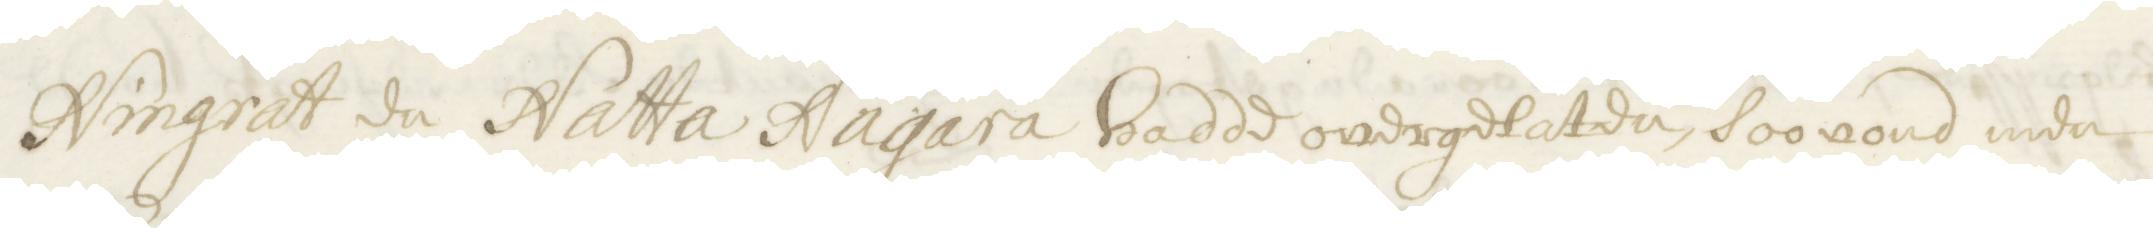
Ningrat en Natta Nagara hadde overgelaten, soo vond men
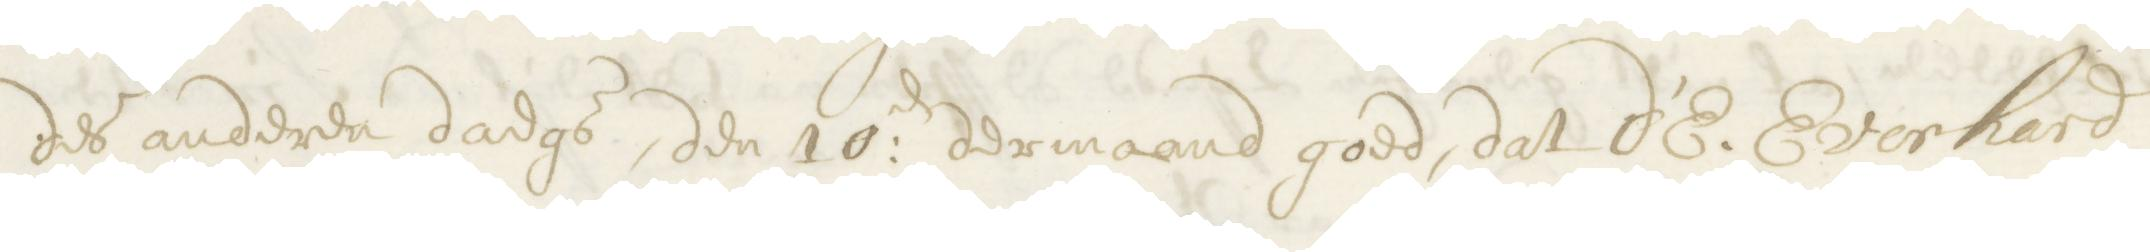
des anderen daegs, den 10:en dermaand goed, dat d'E. Everhard
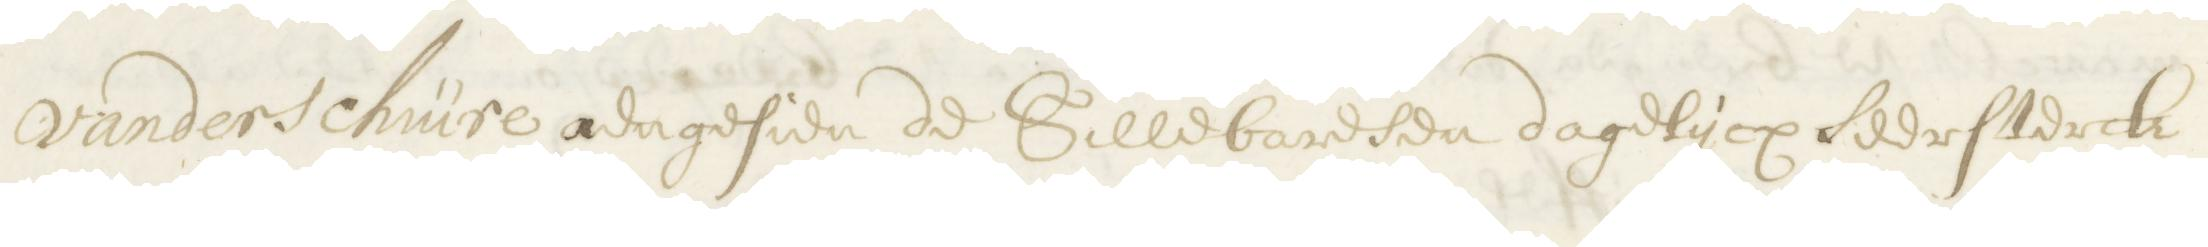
vander schüre aengesien de Sillebaresen dagelijcx seer sterck
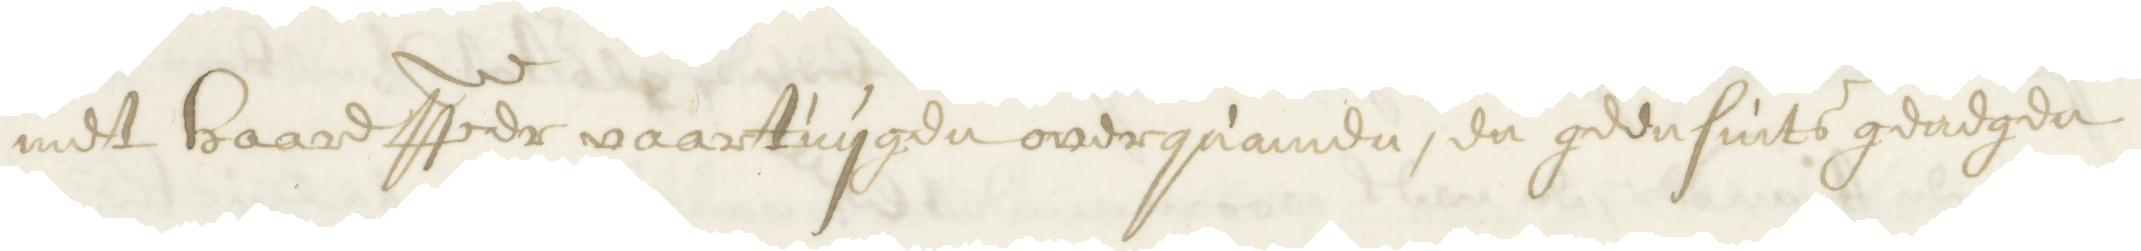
met haare pper vaartuijgen overquamen, en geensints genegen
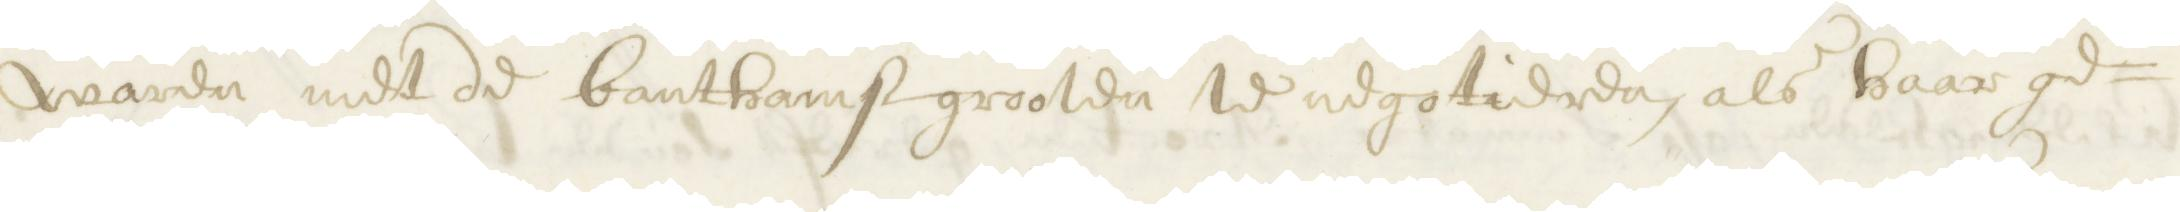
waren met de banthamst grooten te negotieren, als haar ge=
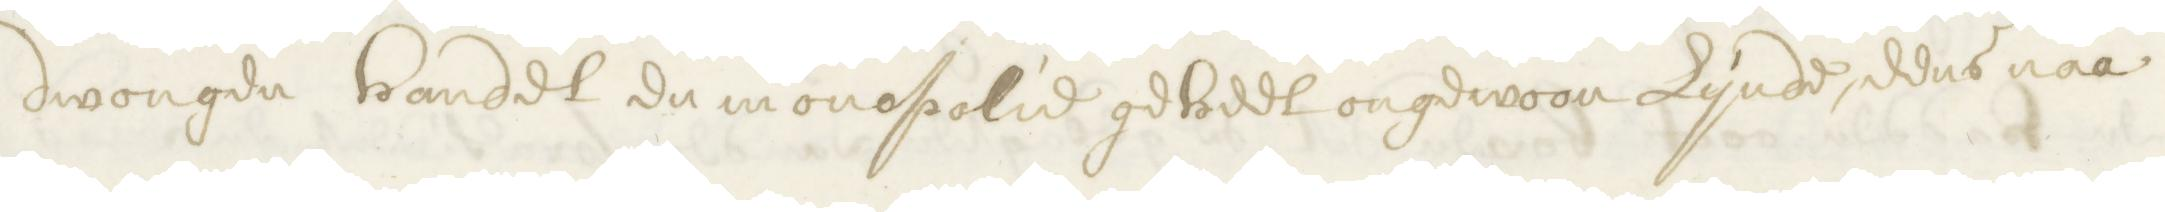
dwongen handel en monopolie geheel ongewoon zijnde, eens naa
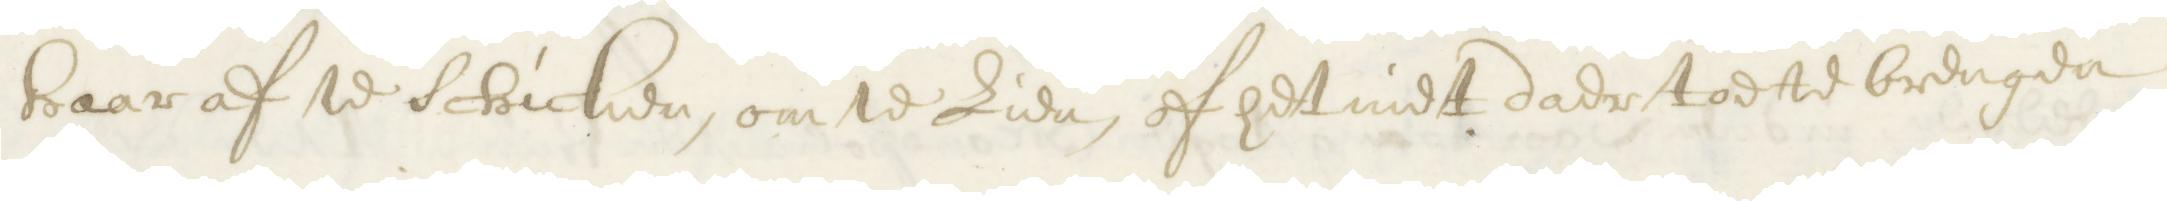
haar af te schicken, om te zien, of het niet daertoe te brengen
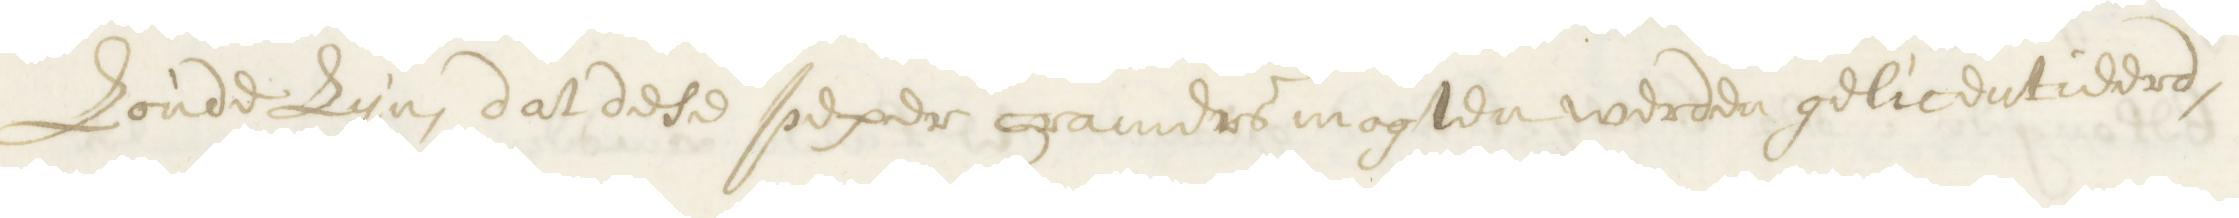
zoude zijn, dat dese peper cramers mogten werden gelicentieerd,
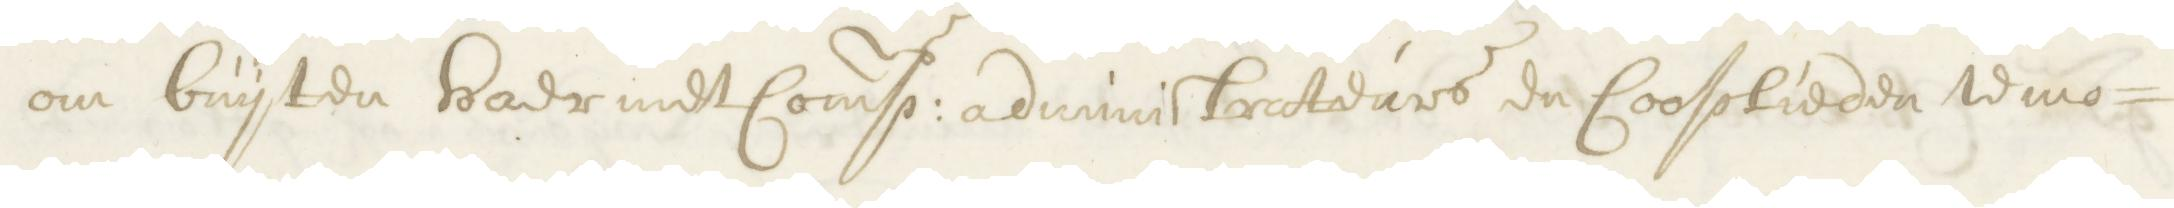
om buijten haer met Comp:s administrateurs en Cooplieden te mo=
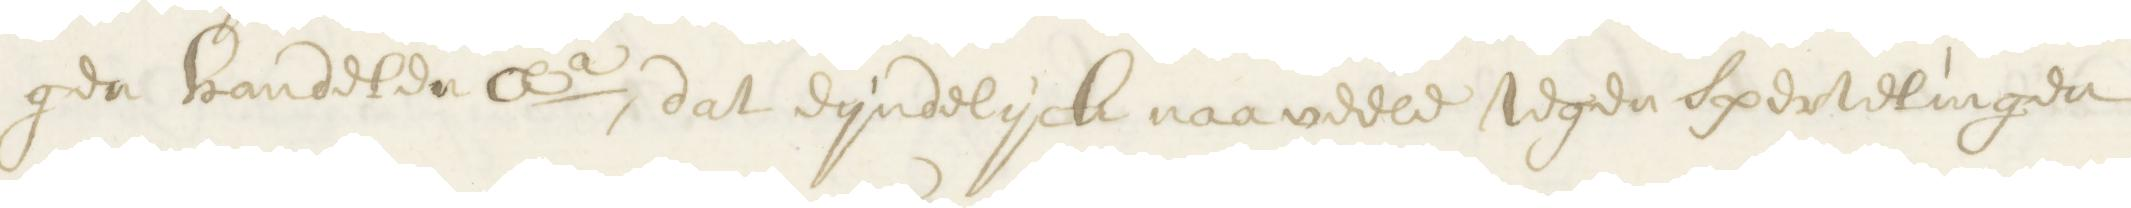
gen handelen A-a, dat eijndelijck naa veele tegen spertelingen
